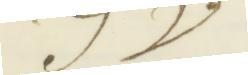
JV
